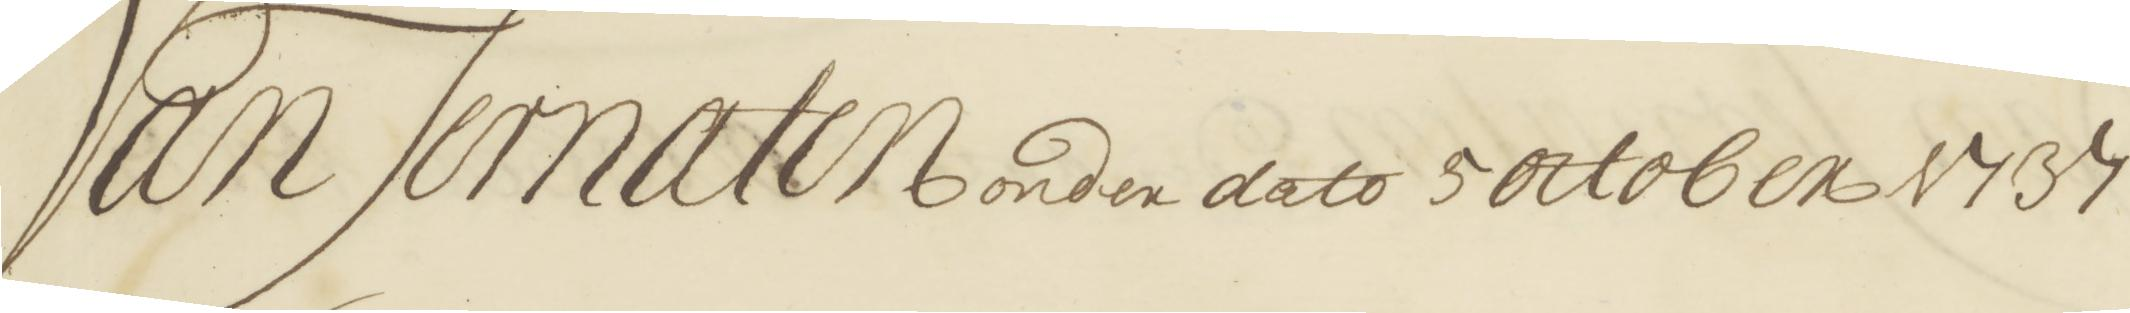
Van Ternaten onder dato 5 october 1737
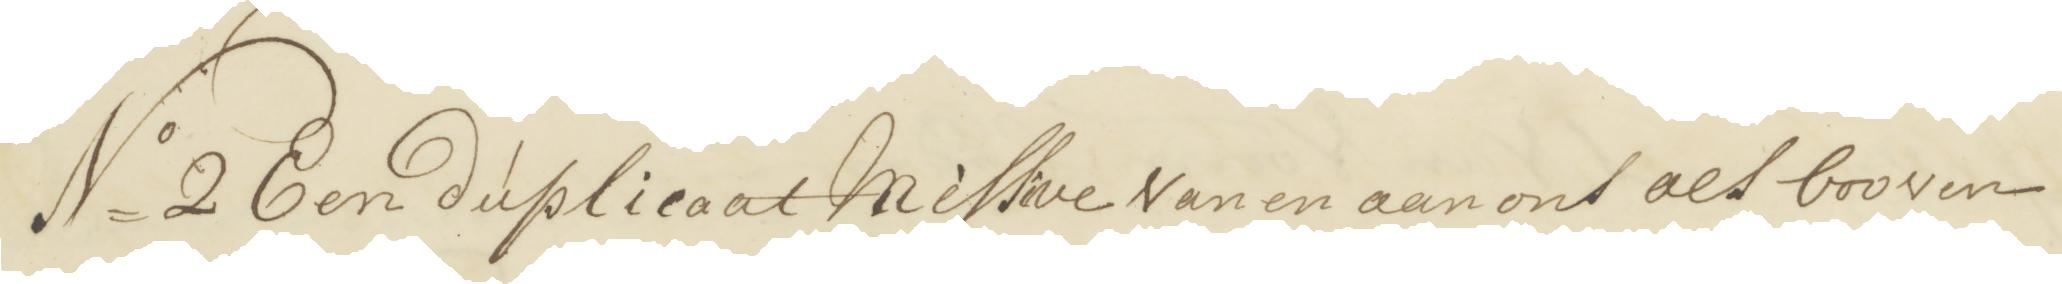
N=o 2 Een duplicaat Missive van en aan ons als booven
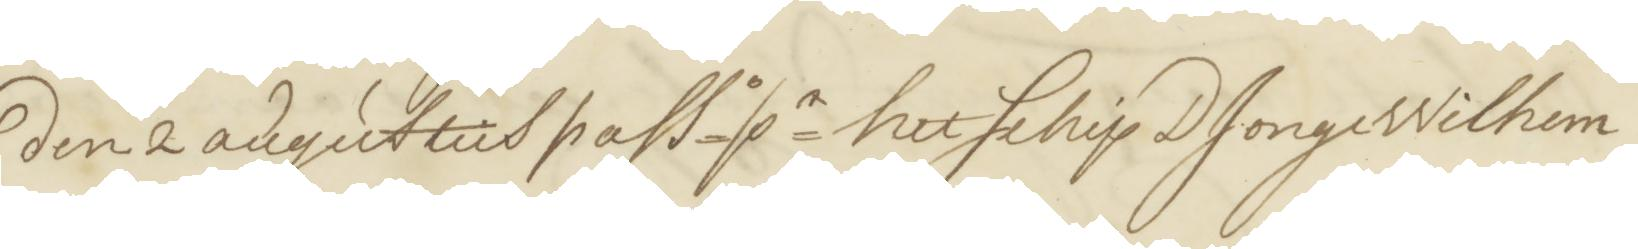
den 2 augustus pass=o p=r het schip D Jonge Wilhem
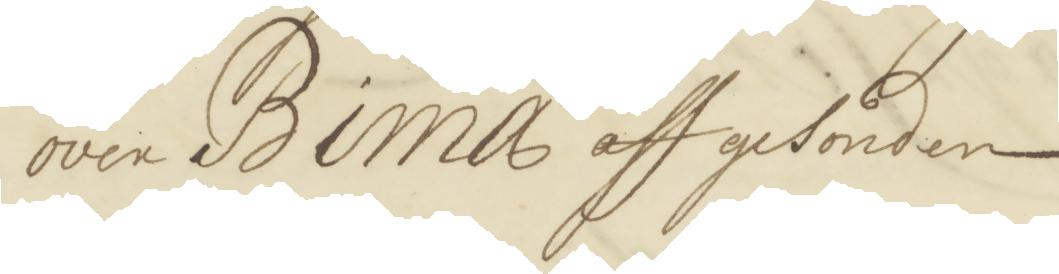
over Bima aff gesonden
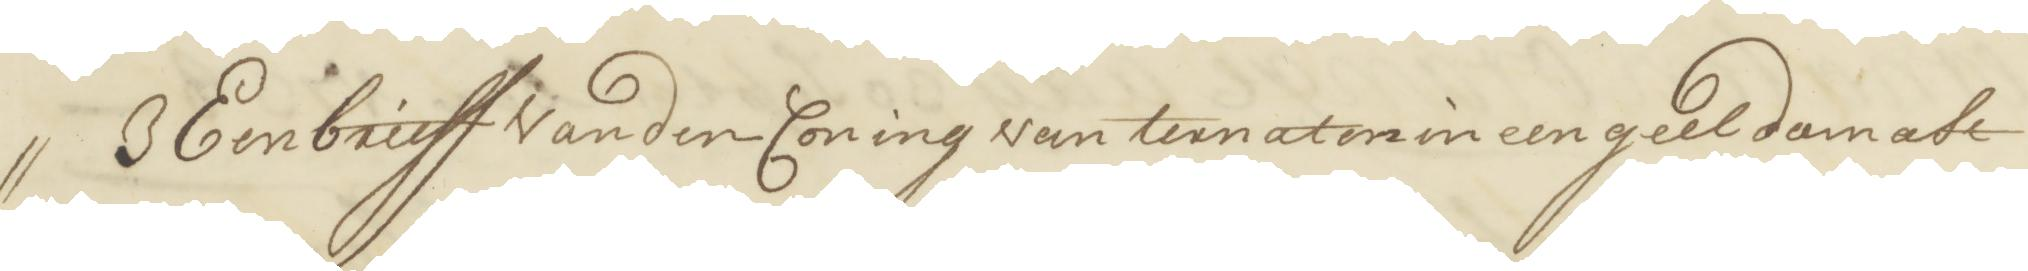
„ 3 Een brieff van den Coning van ternaten in een geel damase
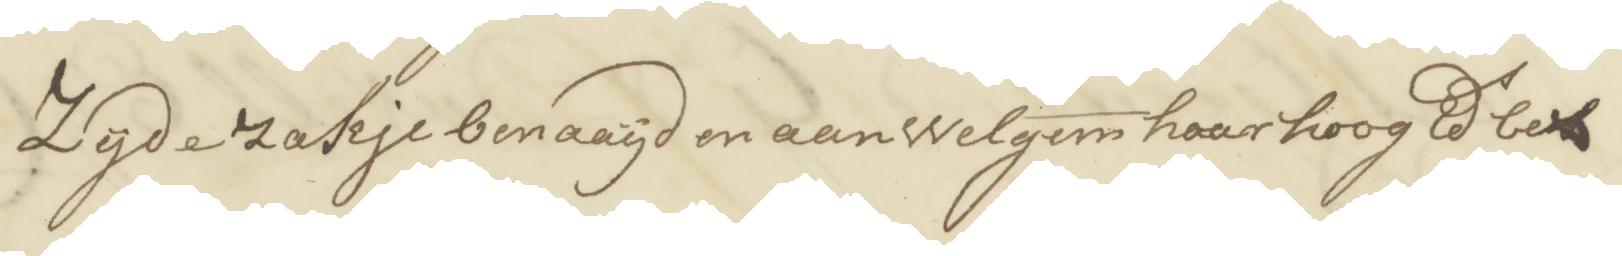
Zijde zakje benaaijd en aan Welgem haar hoog Eds bes
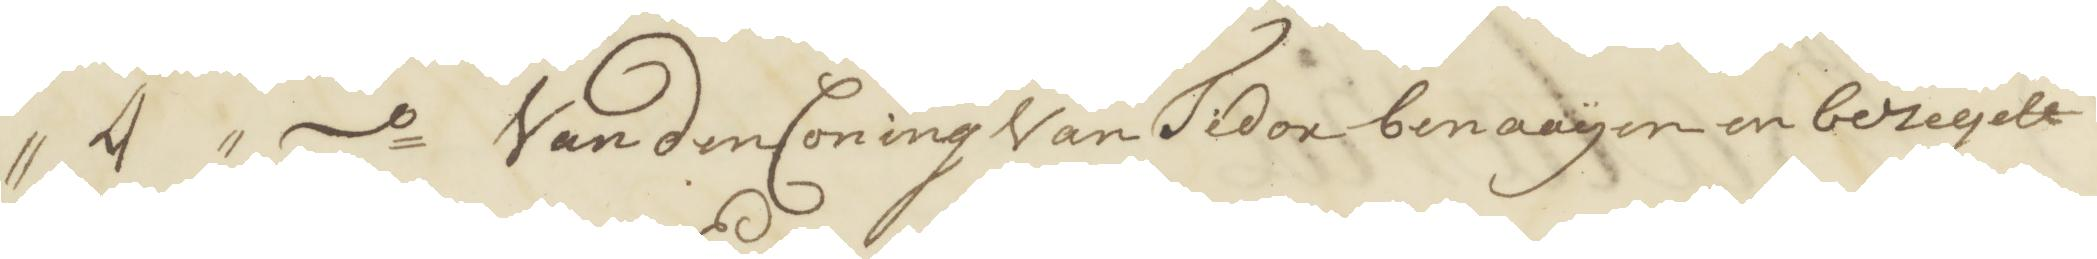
„ 4 „ _=o van den Coning van Tidor benaaijen en bezegelt
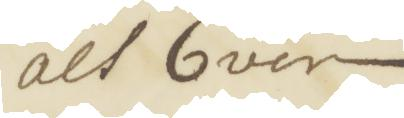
als Even
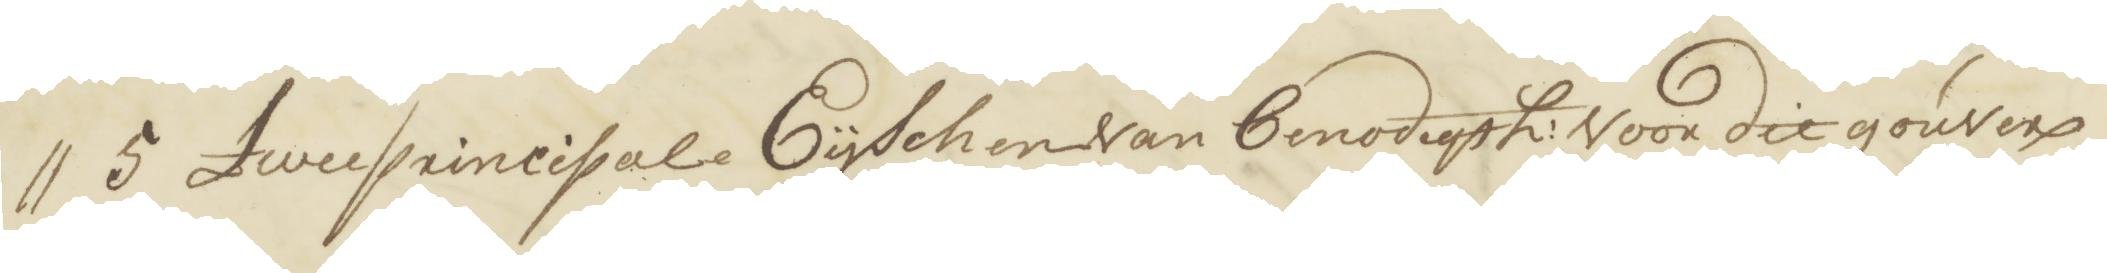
„ 5 twee principale Eijschen van benodigth: voor die gouver
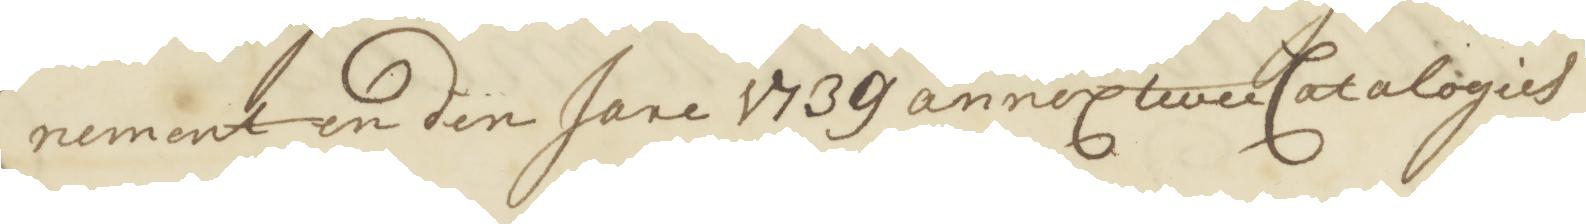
nement en den Jare 1739 annex twee Catalogies
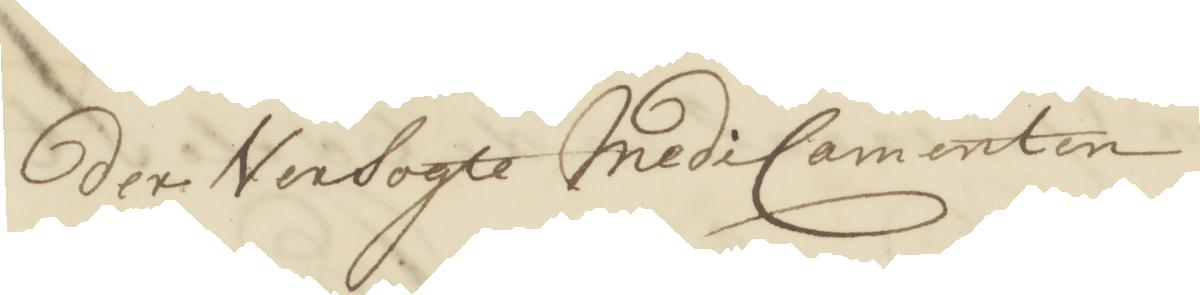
der versogte medicamenten
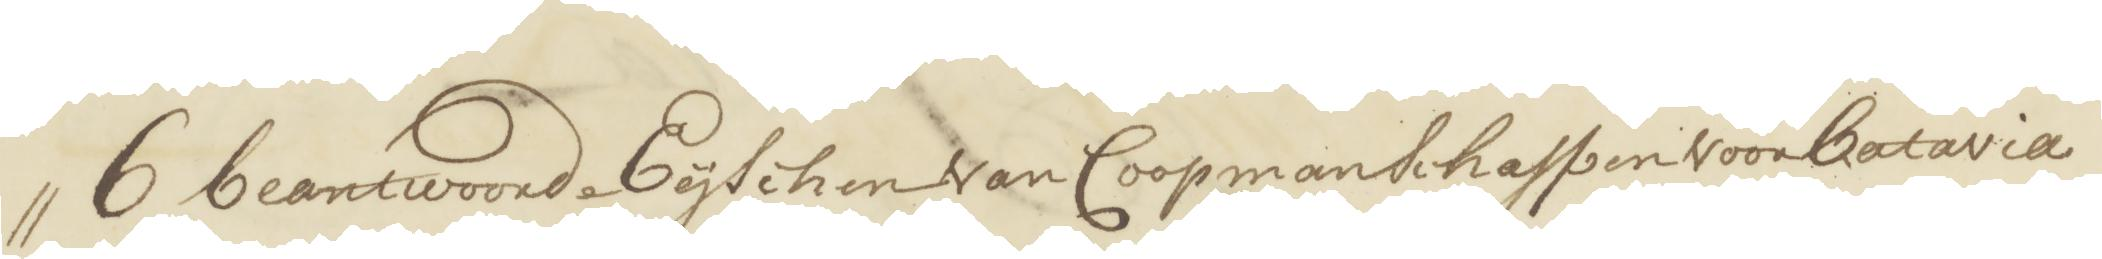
„ 6 beantwoorde Eijschen van Coopmanschappen voor batavia
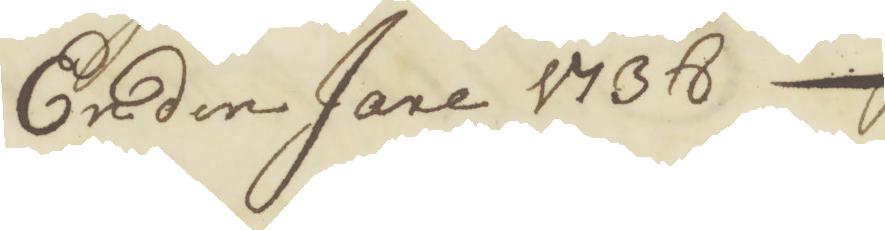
En den Jare 1738 —
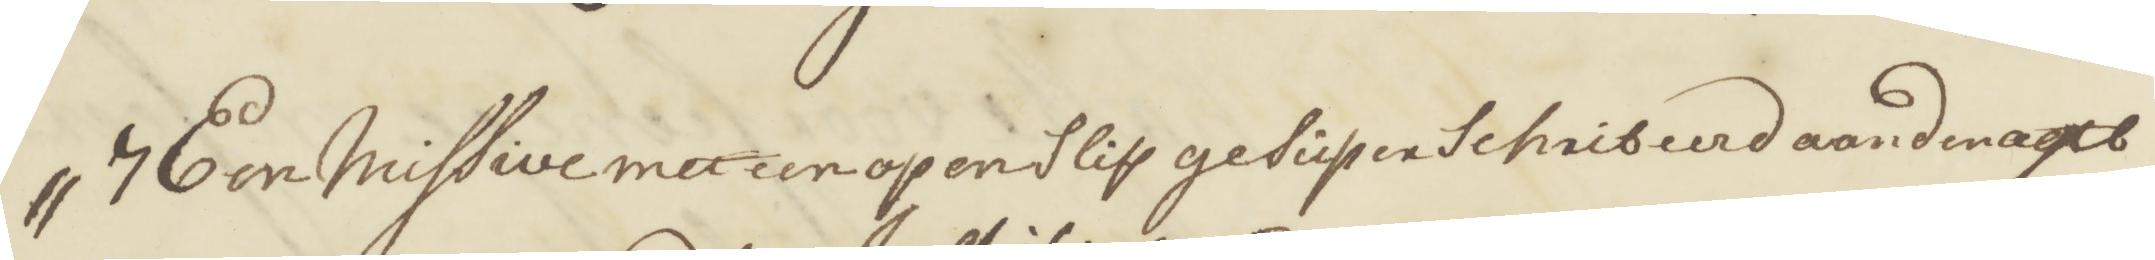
„ 7 Een missive met een op en slip gesuperschribeerd aan den agtb
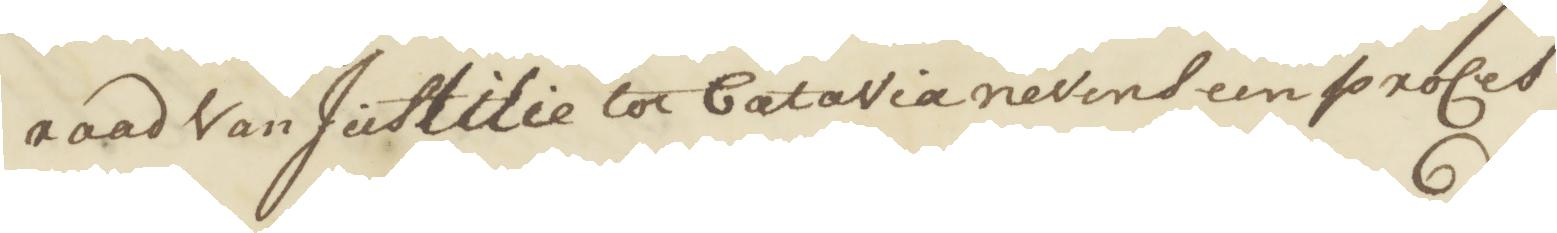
raad van Justitie tot batavia nevens een proces
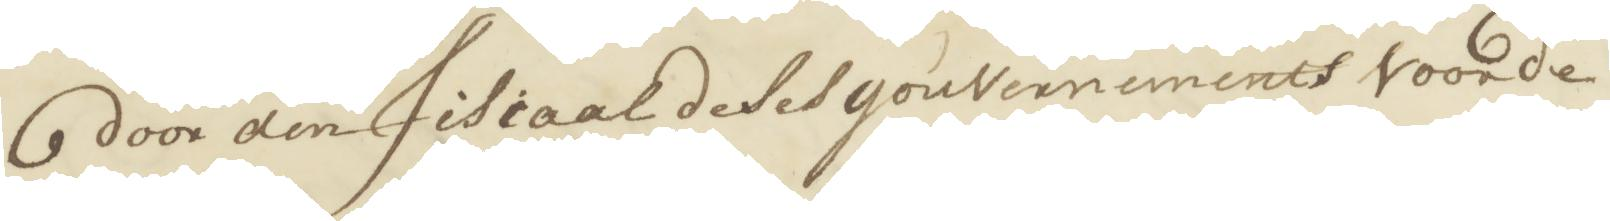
door den fiscaal deses gouvernements voor de
